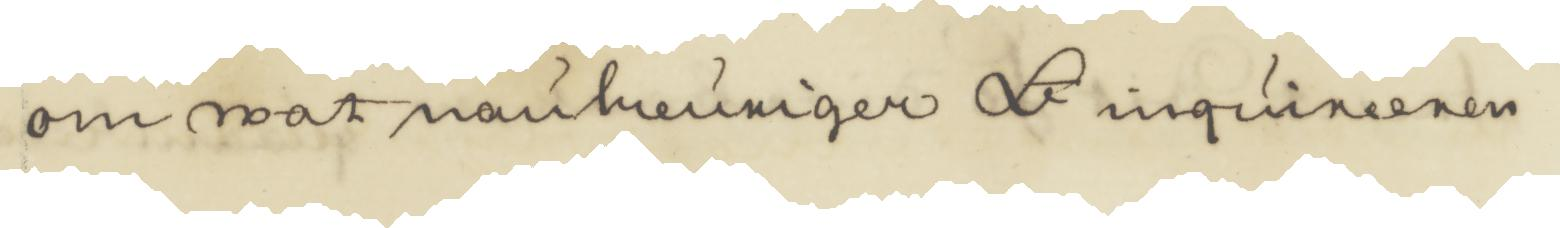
om wat naukeuriger te inquireeren
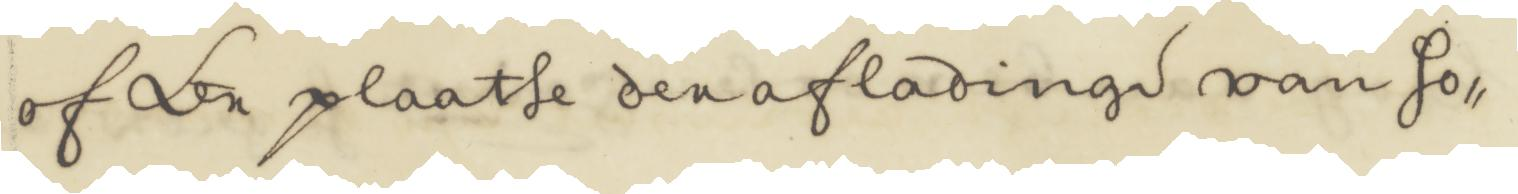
of ter plaatse der afladinge van So„
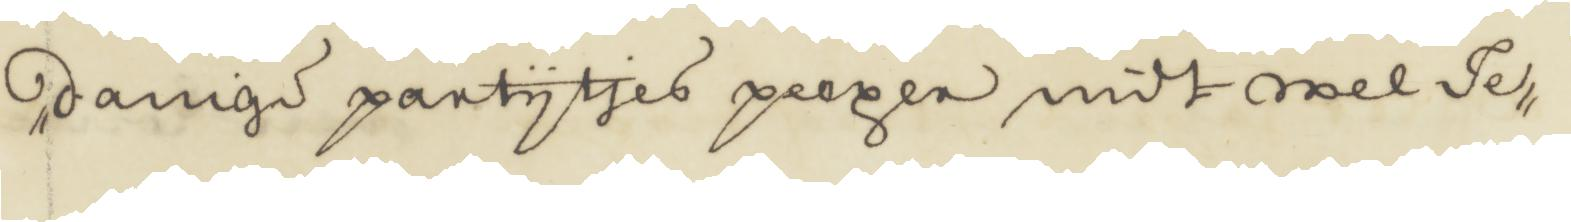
danige partijtjes peeper niet wel Ee„
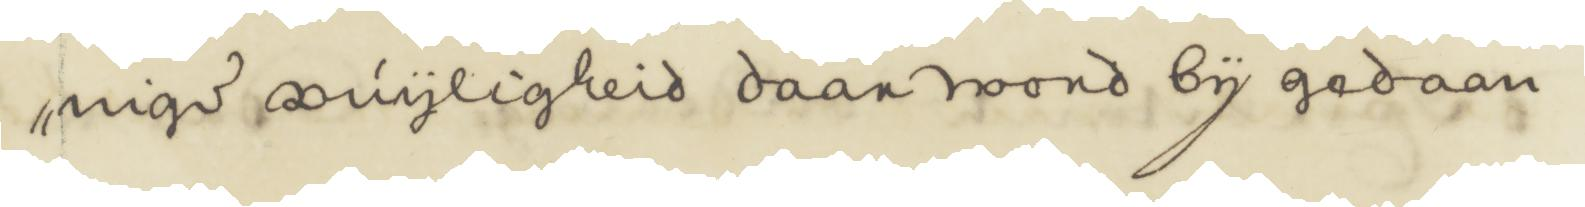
„nige vuijligheid daar word bij gedaan
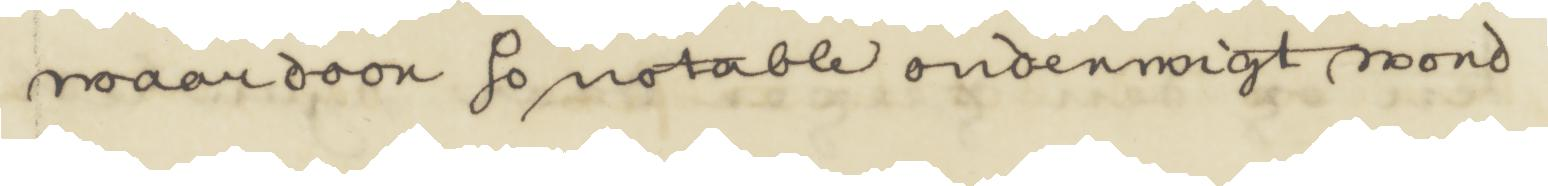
waardoor So notable onderwigt word
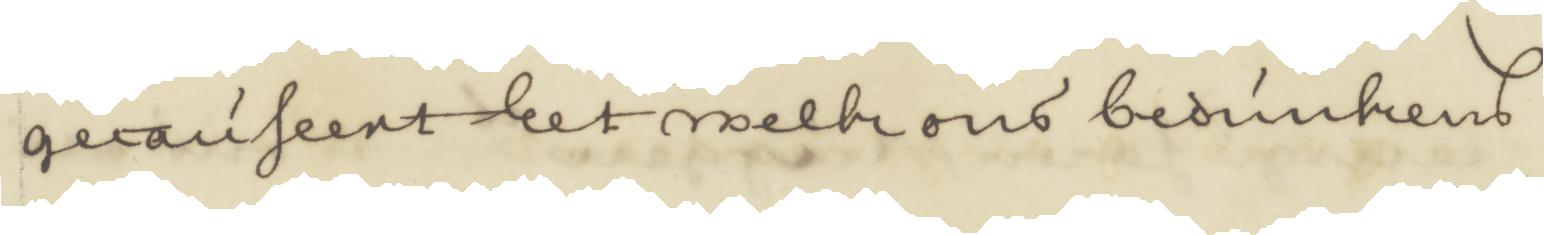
gecauseert het welk ons bedunkens
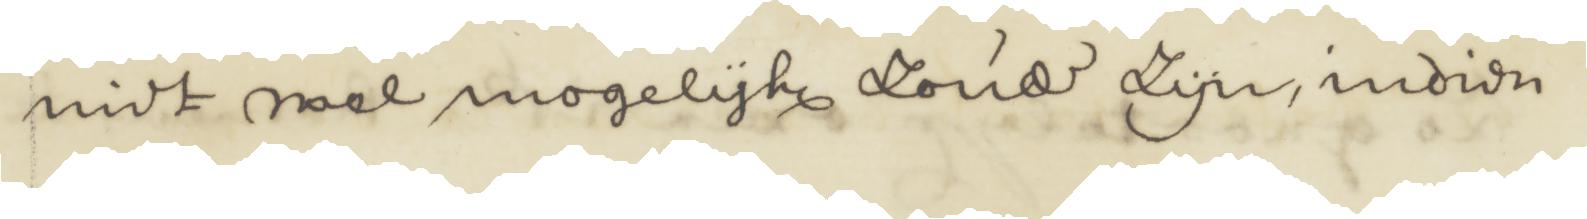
niet wel mogelijk Zoude Zijn, indien
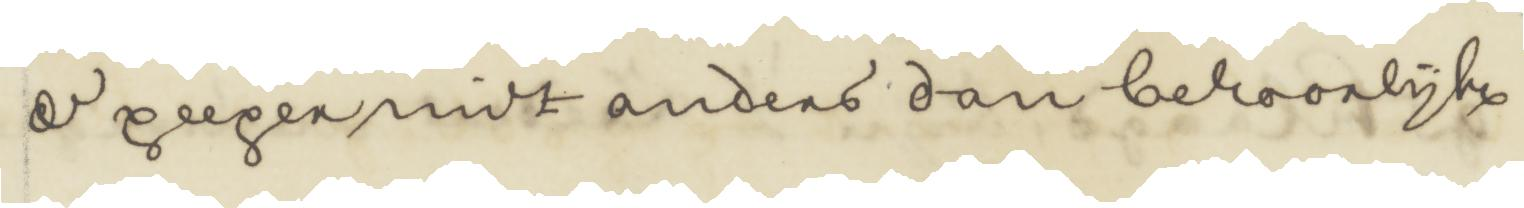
de peeper niet anders dan behoorlijk
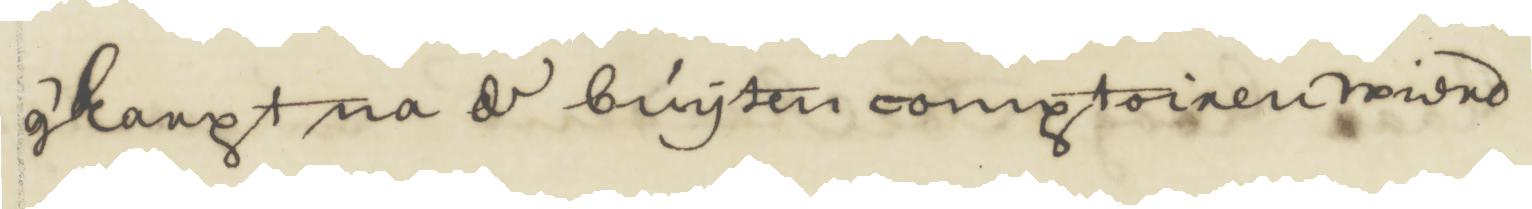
g’harpt na de buijten comptoiren wierd
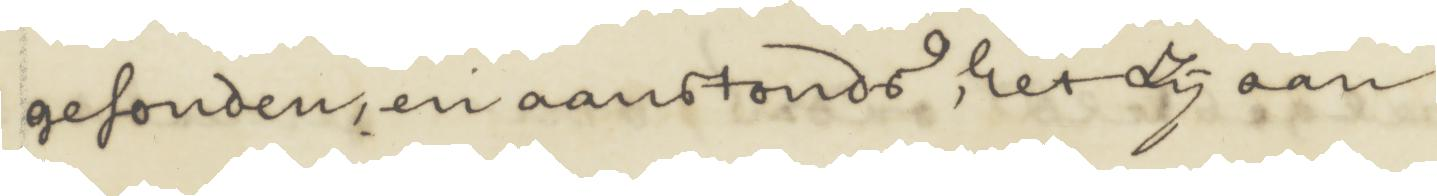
gesonden, en aanstonds, het Zij aan
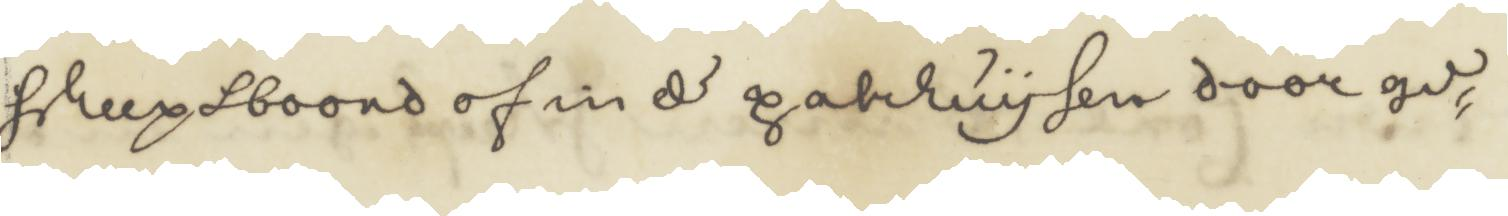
scheepsboord of in de pakhuijsen door ge„
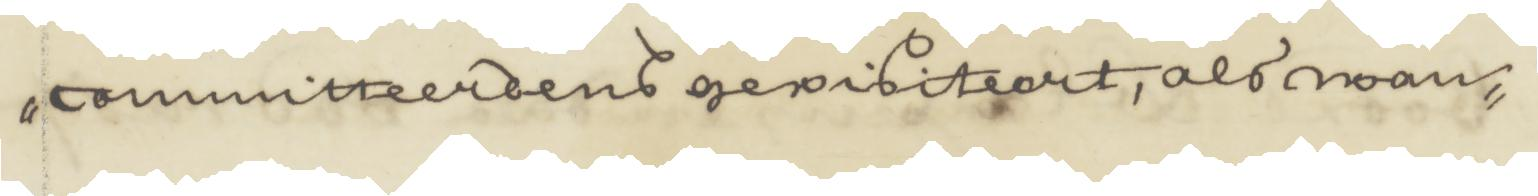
„committeerdens gevisiteert, als wan„
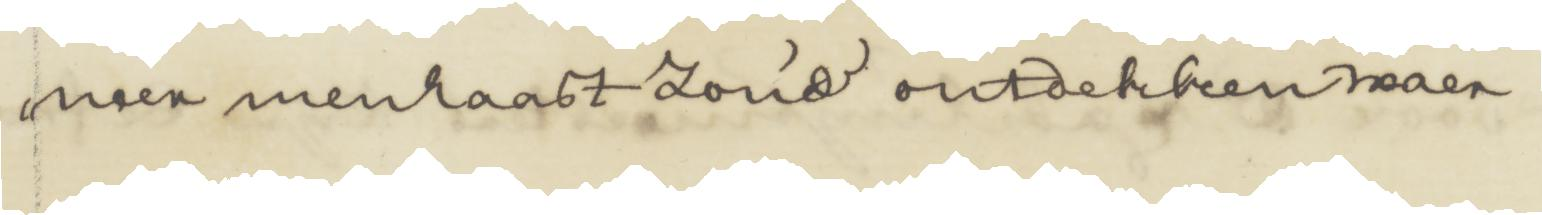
neer men haast zoude ontdekken waer
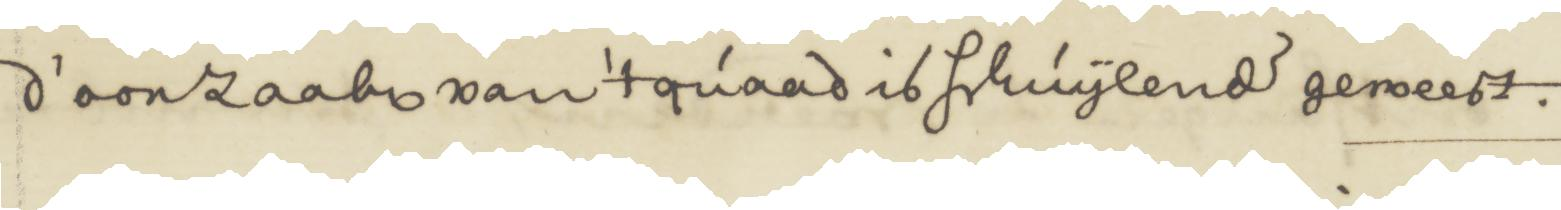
d’oorzaak van ’t quaad is Schuijlende geweest.
